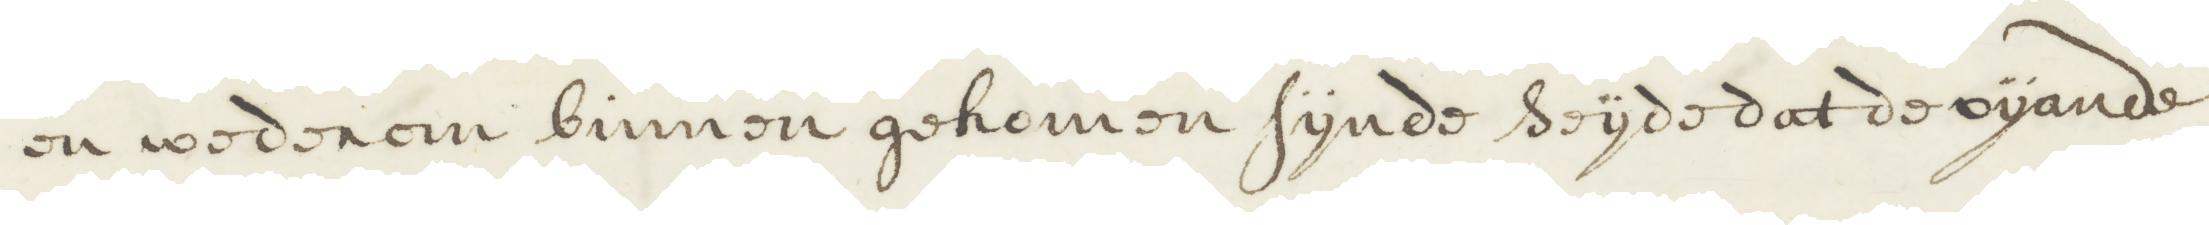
en wederom binnen gekomen sijnde seijde dat de vijande
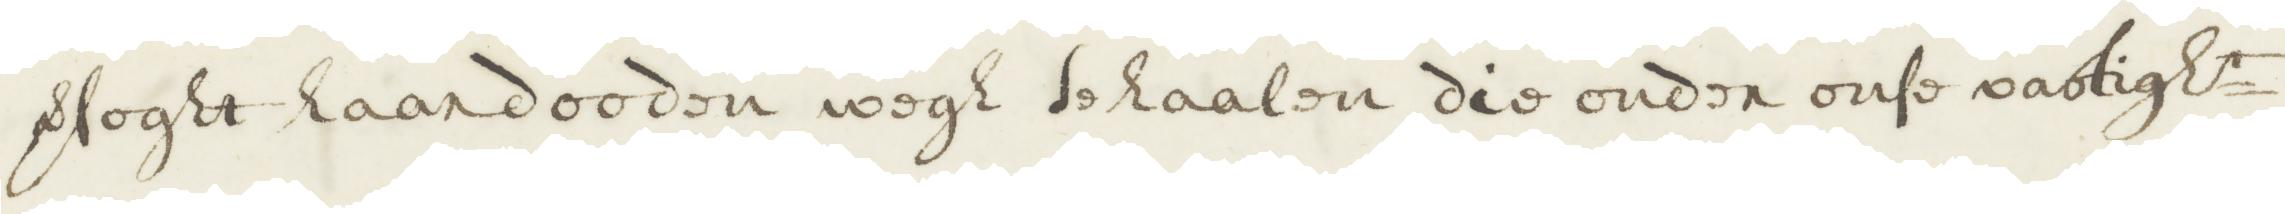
versoght haar dooden wegh te haalen die onder onse vastigh=t
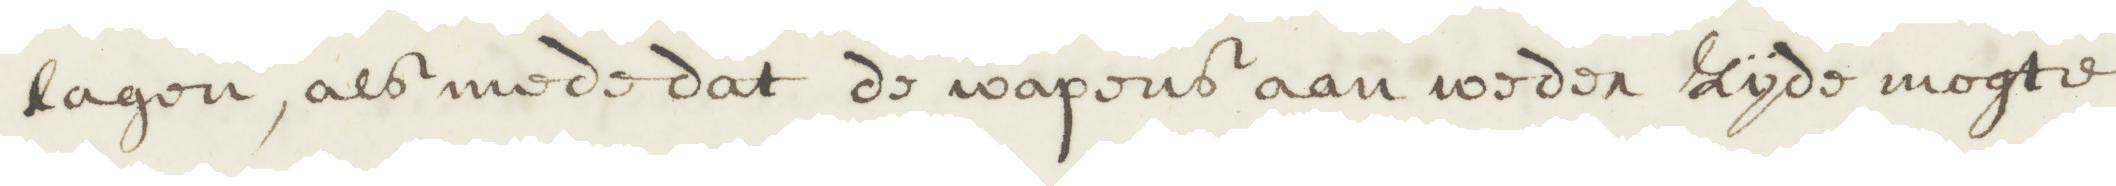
lagen, als mede dat de wapens aan weder zijde mogte
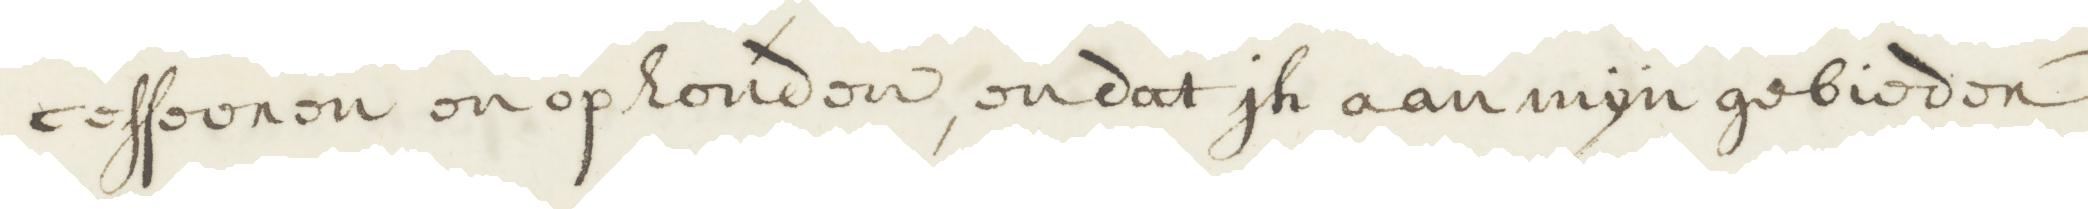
cesseeren en ophouden, en dat jk aan mijn gebieder
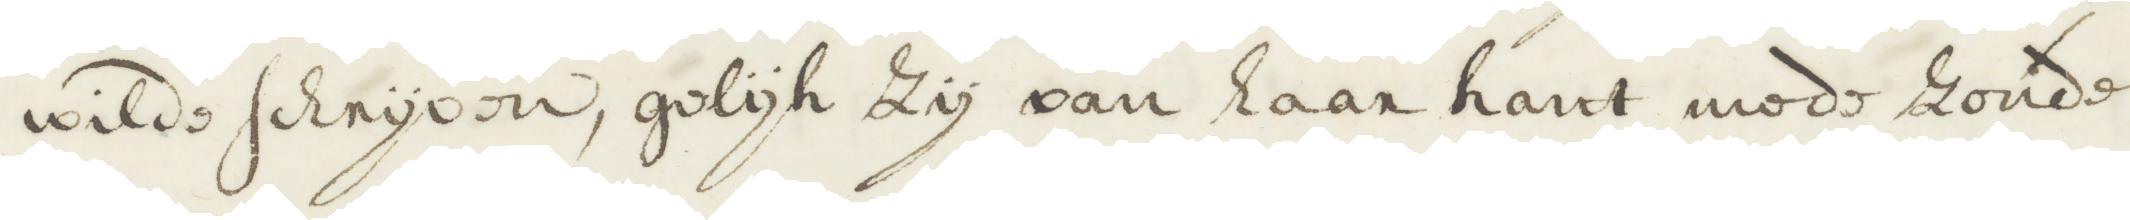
wilde schrijven, gelijk zij van haar kant mede zoude
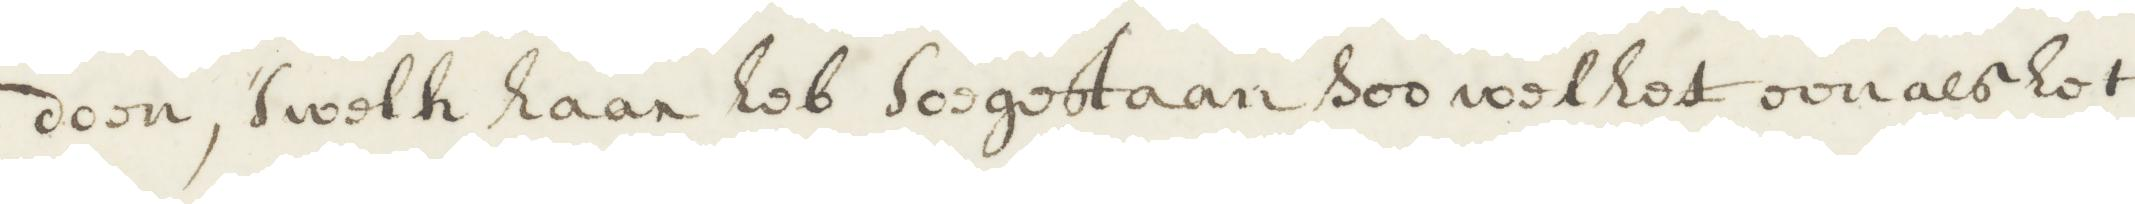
doen, 't welk haar heb toegestaan, soo wel het een als het
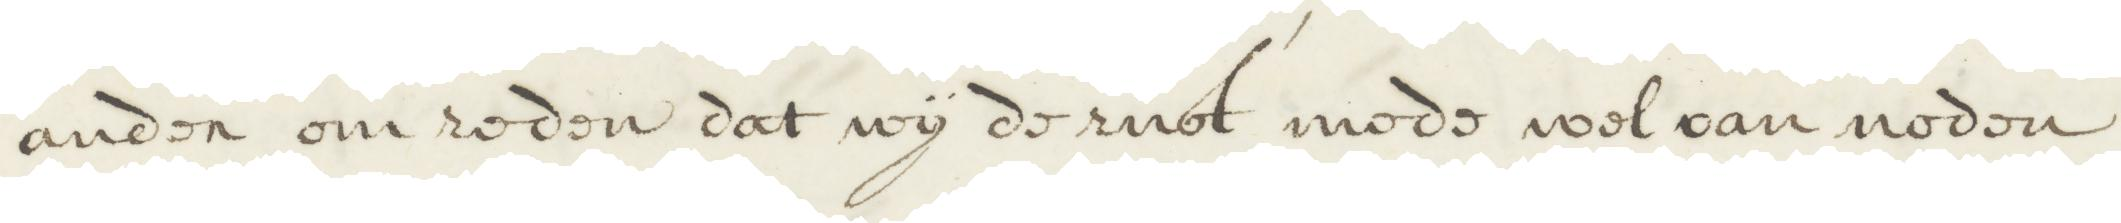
ander, om reden dat wij de rust mede wel van noden
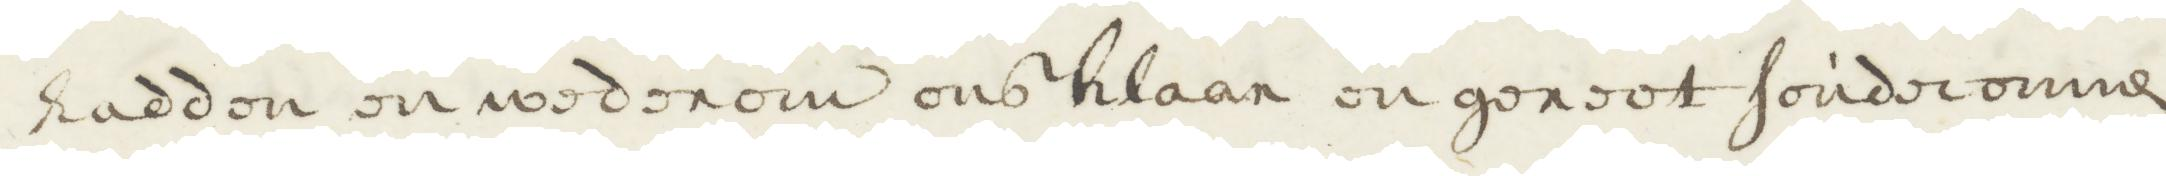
hadden, en wederom ons klaar en gereet soude connen
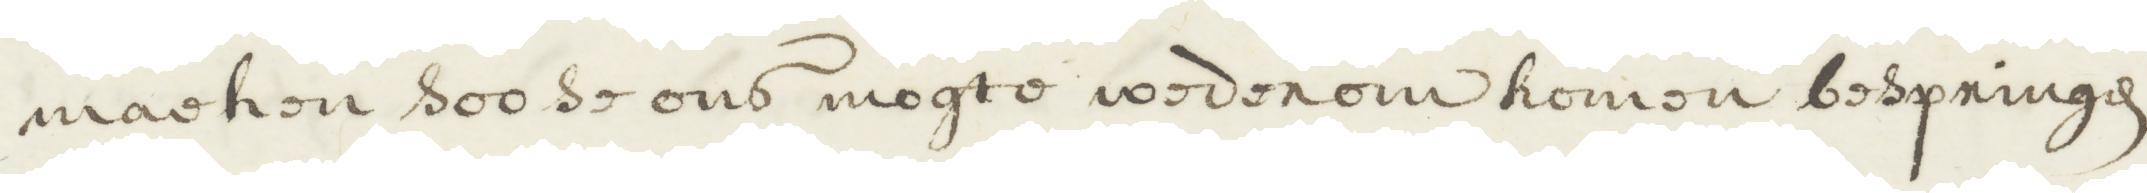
maeken, soo se ons mogte wederom komen bespringen
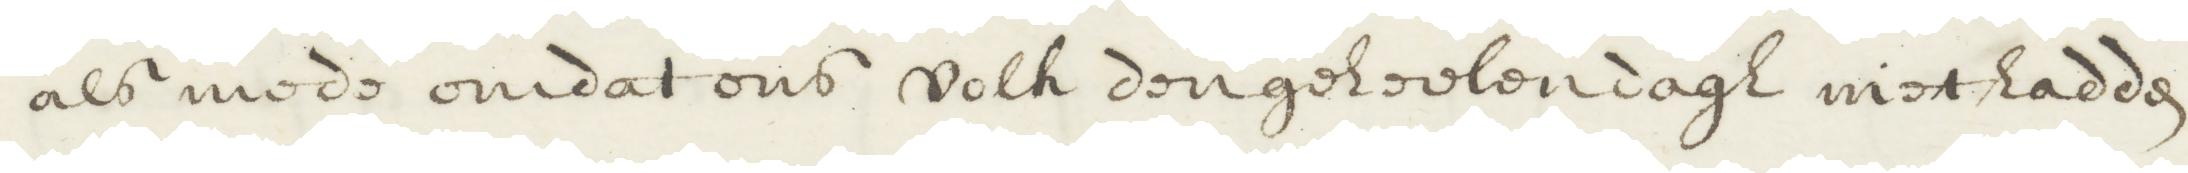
als mede omdat ons volk den geheelen dagh niet hadden
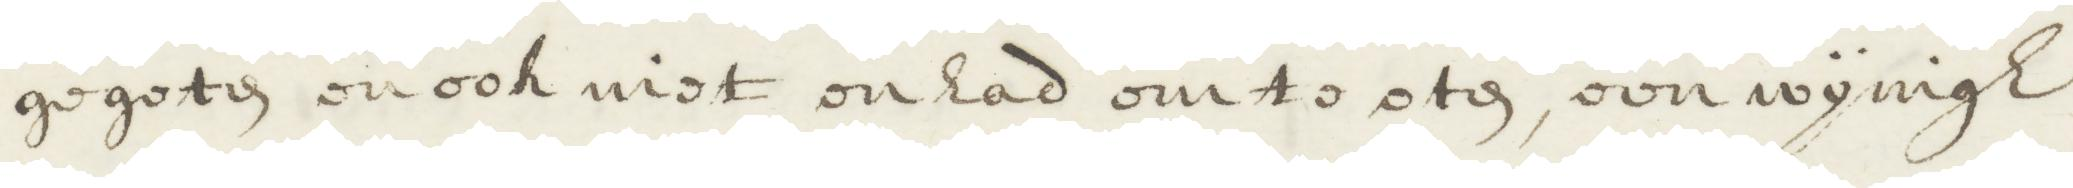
gegeten en ook niet en had om te eten, een wijnigh
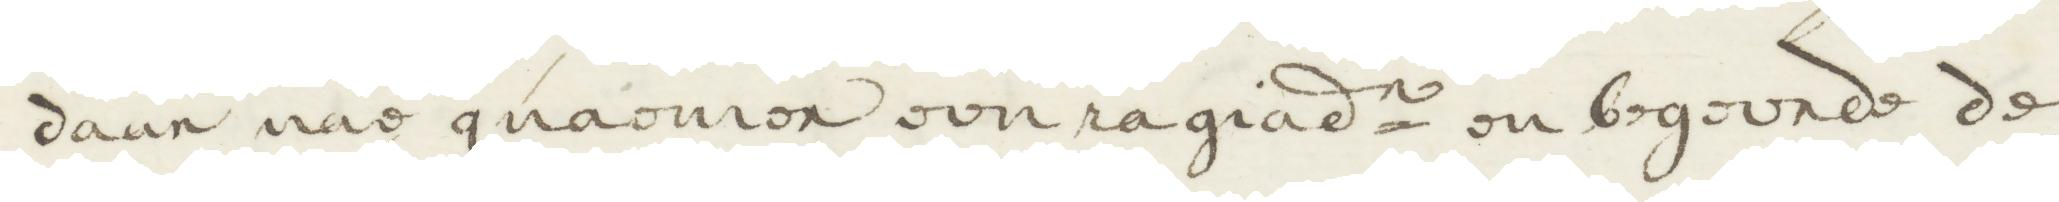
daar nae quaemer een ragiad=r en begeerde de
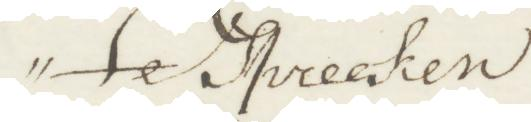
„ te Spreeken
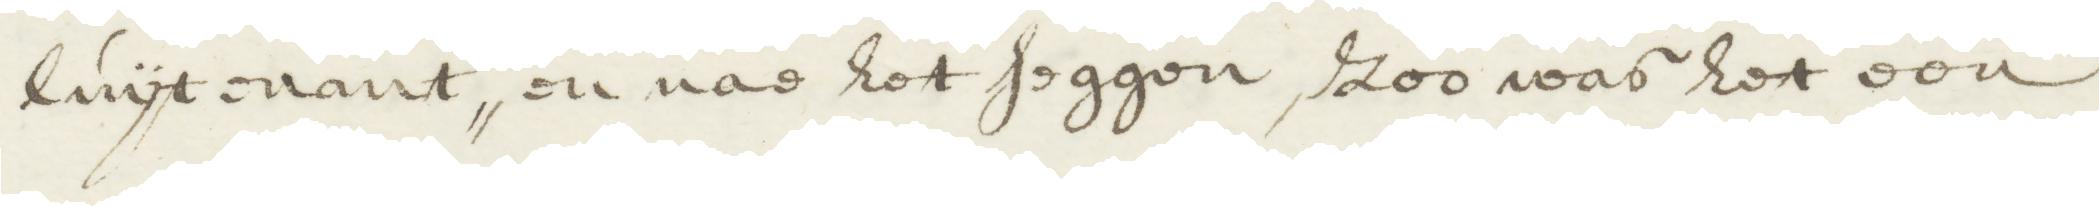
luijtenant „ en nae het seggen, zoo was het een
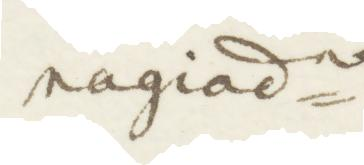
ragiad=r
